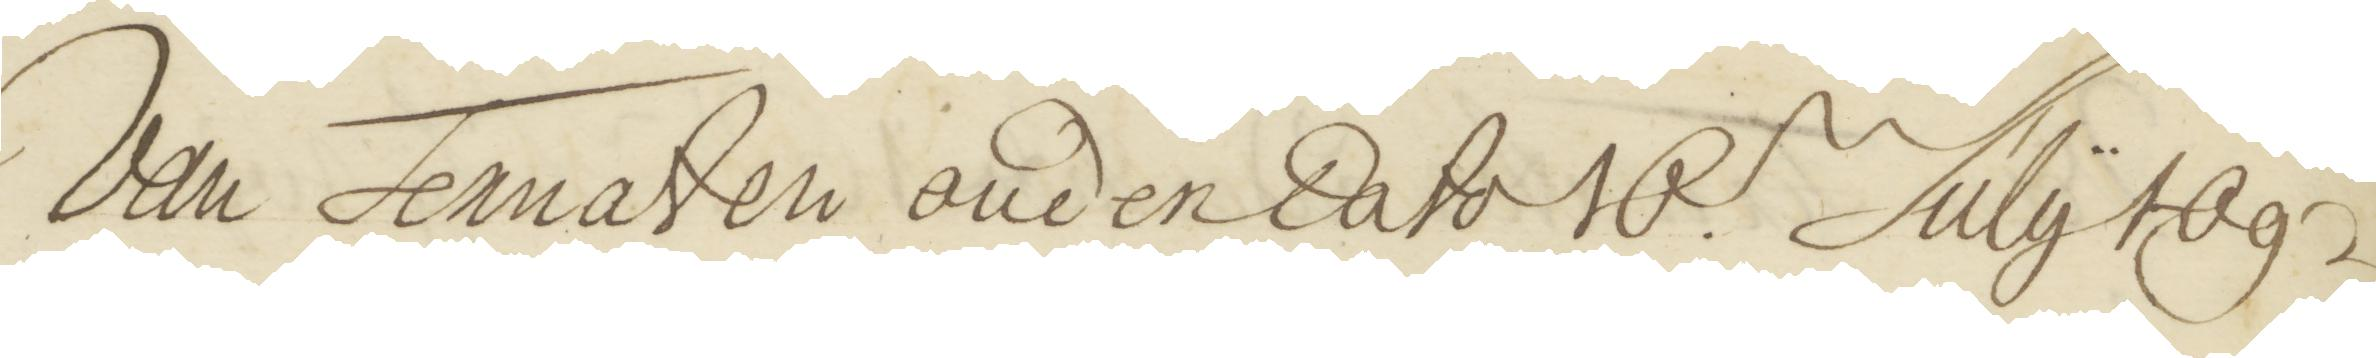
Van Ternaten onder dato 16.' Iulij 1692
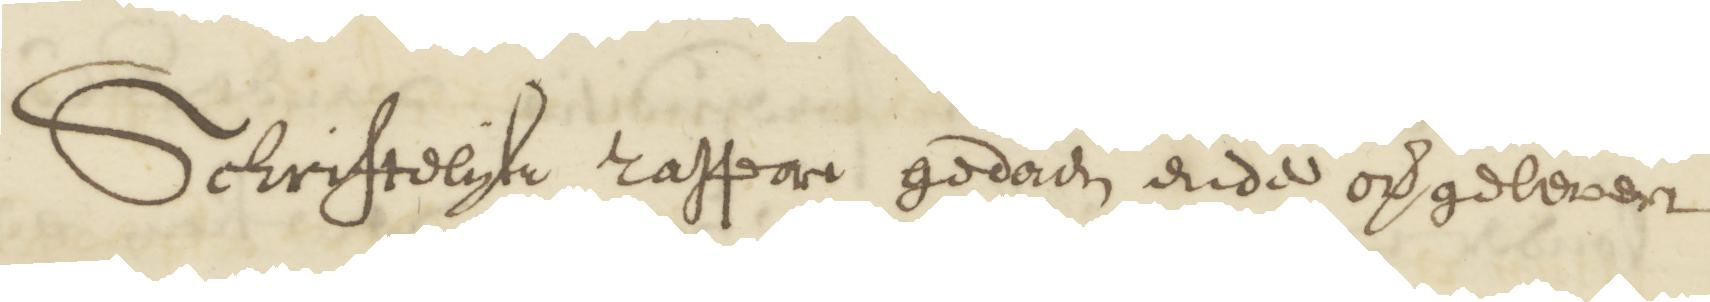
Schriftelijk rapport gedaen ende overgelevert
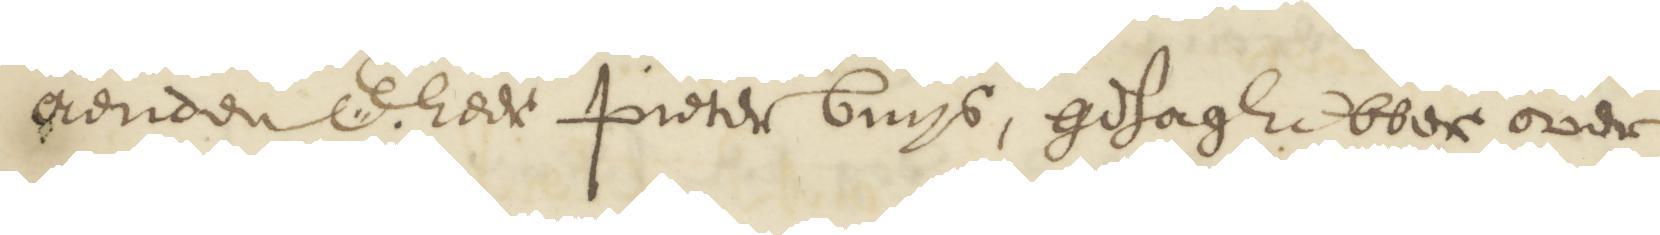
aenden E. heer pieter buijs, gesaghebber over
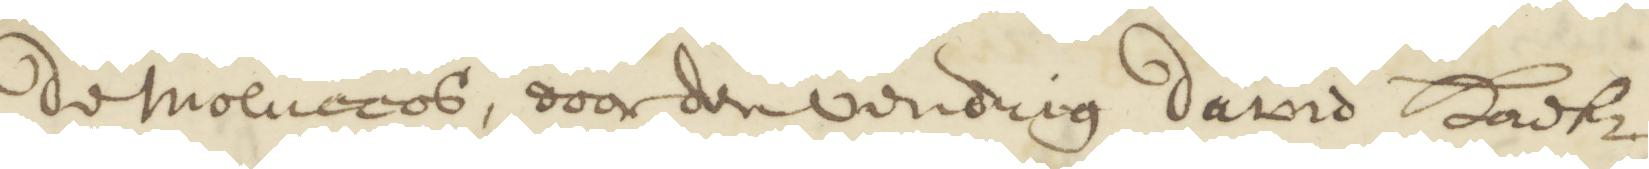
de moluccos, door den vendrig david Haek,
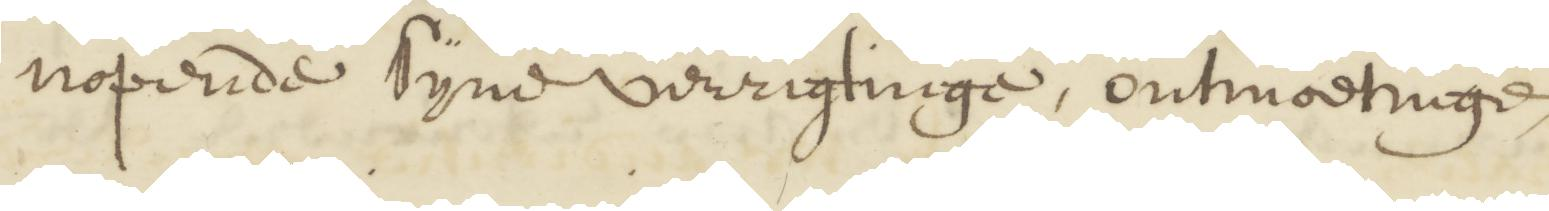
nopende sijne verrigtinge, ontmoetinge,
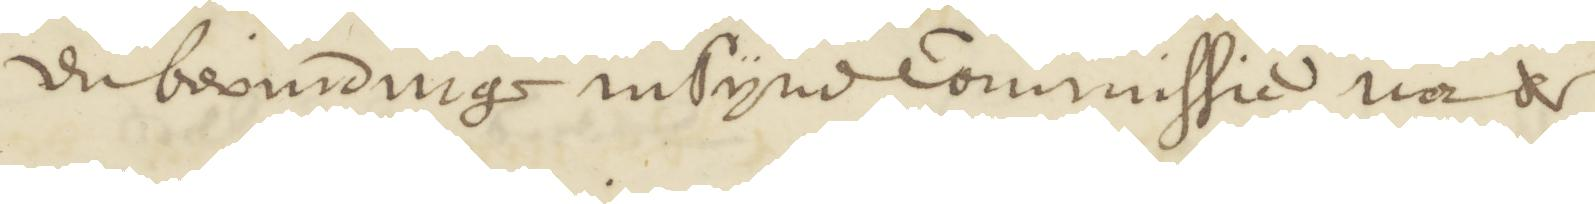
en bevindinge in sijne Commissie na de
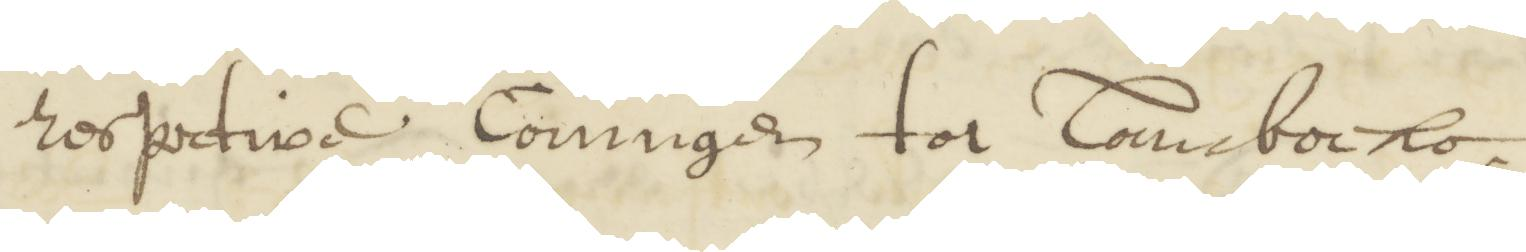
respective Coningen tot Tambocko,
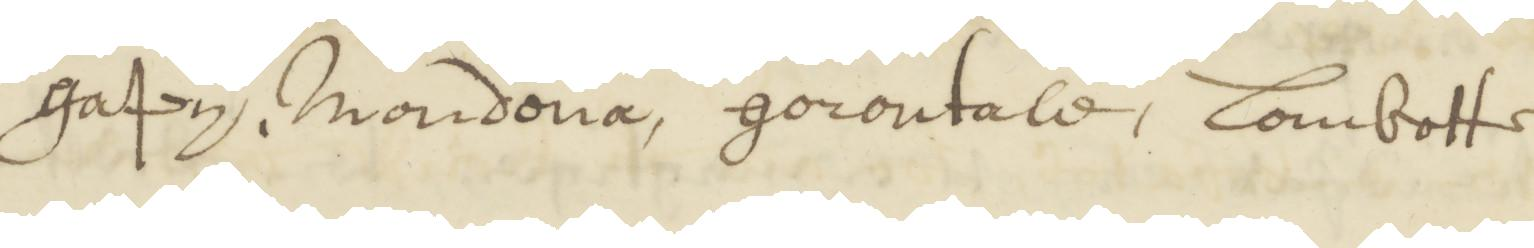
gapij, mondona, gorontale, lombotte
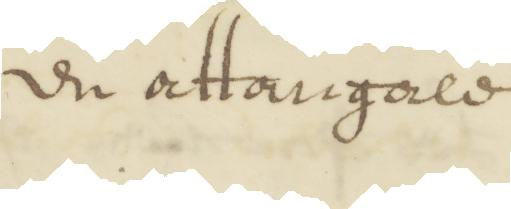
en attangale
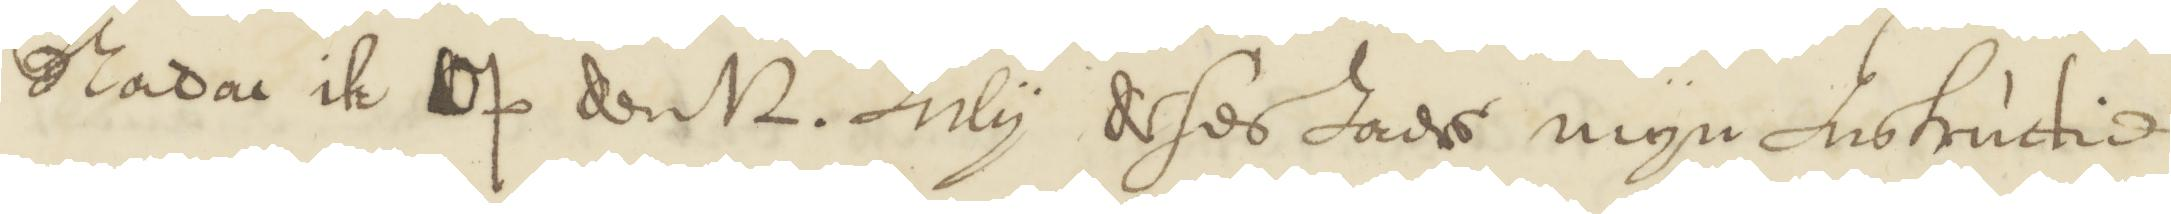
Nadat ik op den 12. Iulij deses Jaer mijn Instructie
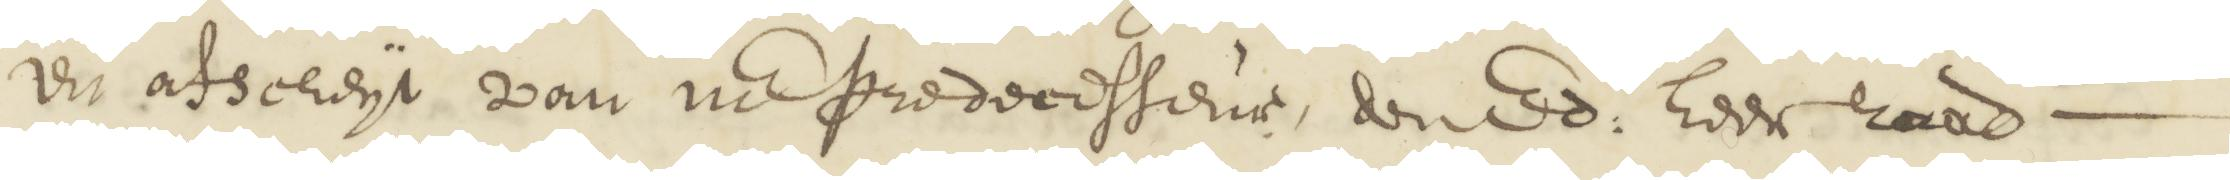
en afscheijt van uE predecesseur, den Ed: heer raad —
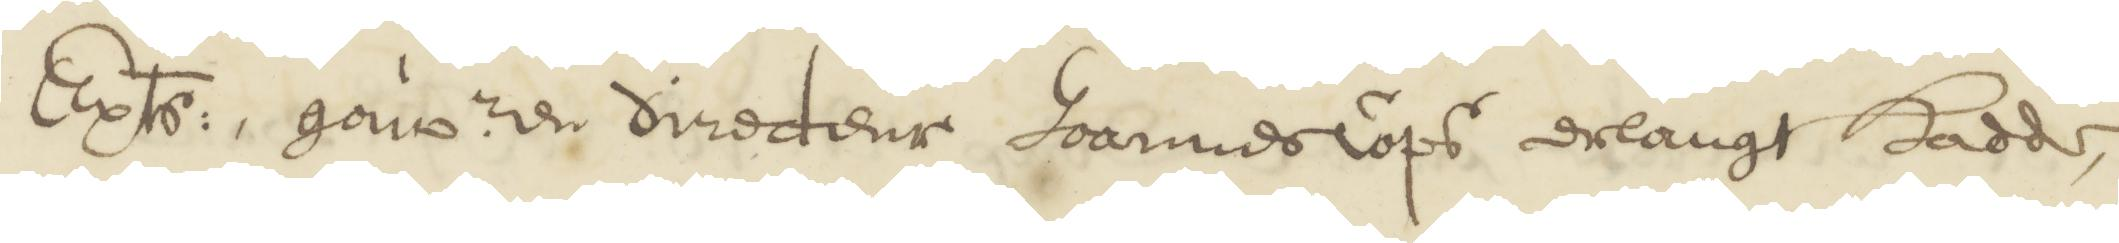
Extr:, gouv:r en directeur Joannes Cops erlangt hadde,
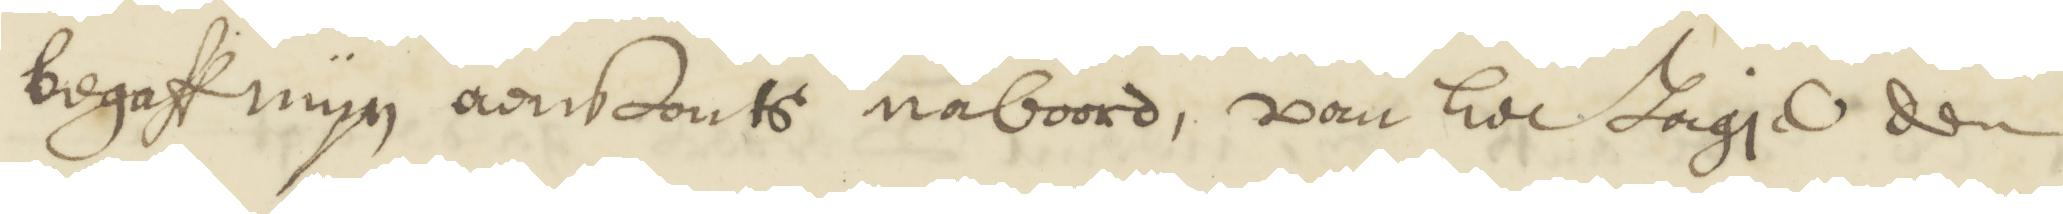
begaff mijn aenstonts naboord, van het Iagje den
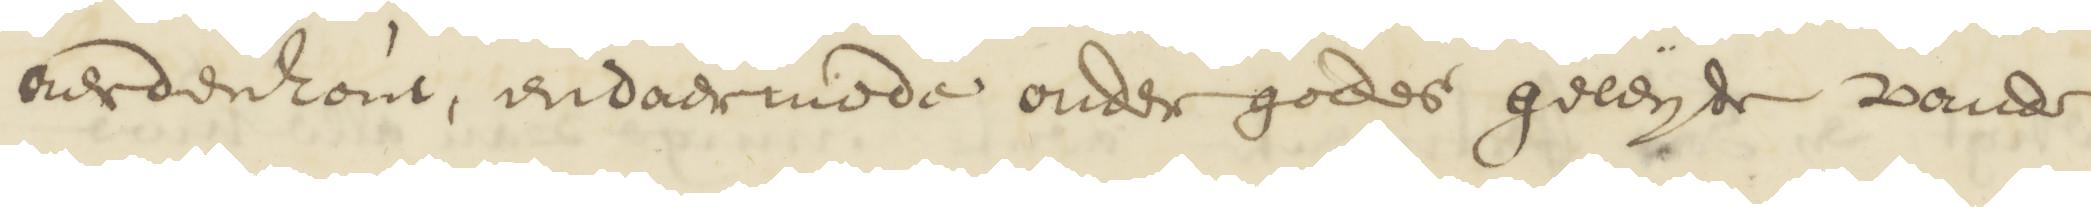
aerdenhout, en daermede onder godes geleijde vande
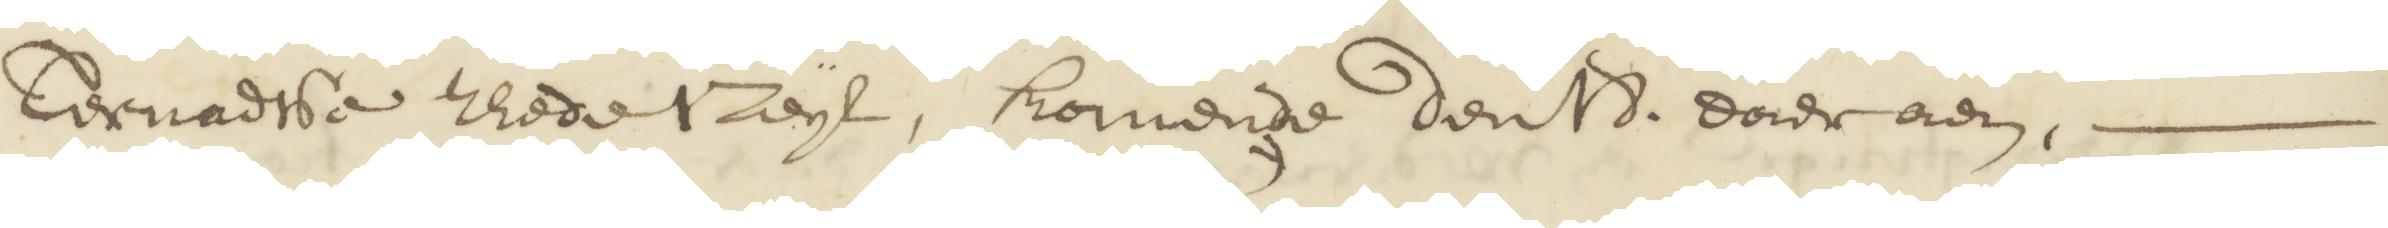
Ternaetse rhede tzeijl, komende den 18. daer aen, —
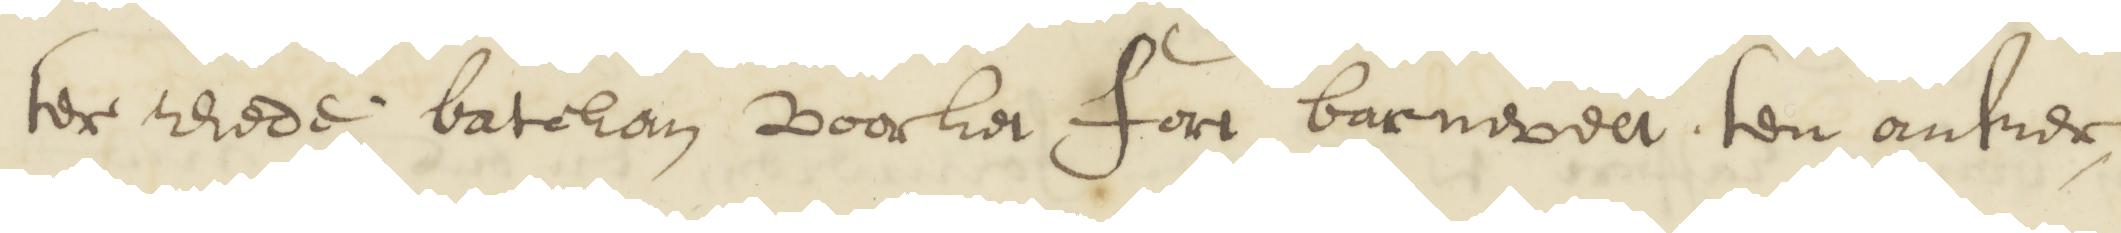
ter rhede batchan voor het fort barnevelt ten anker,
